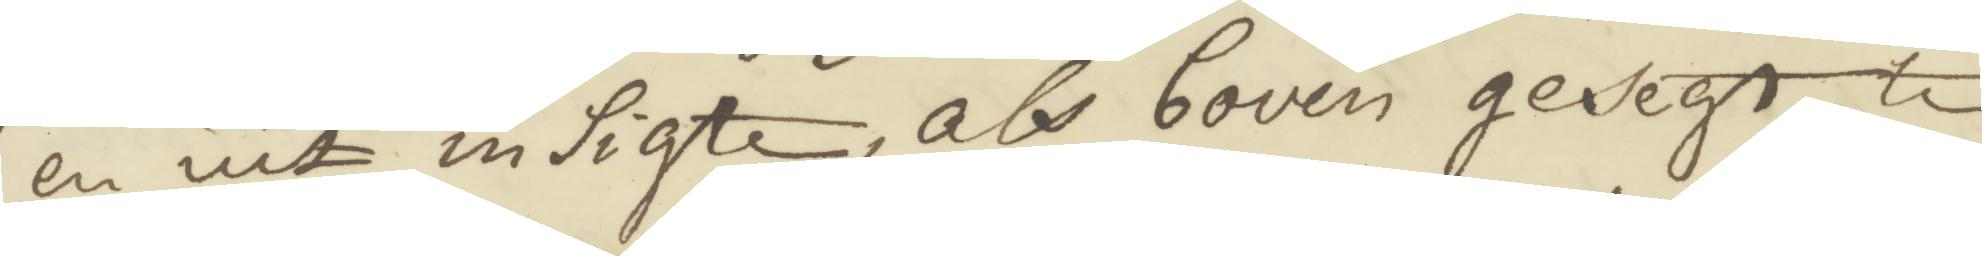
en uit in sigte, als boven gesegt, te
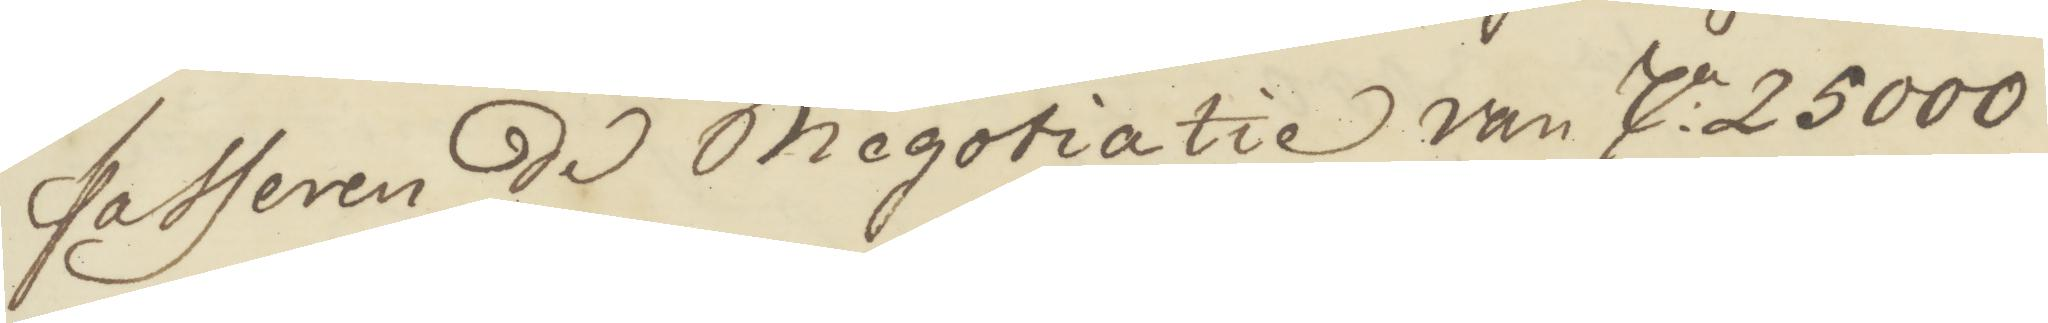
passeren de negotiatie van r:a 25000
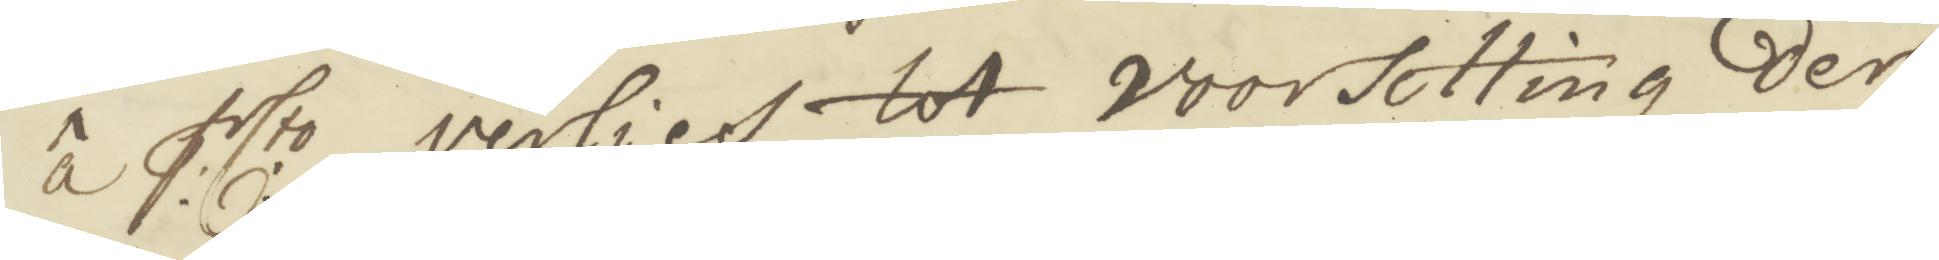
½ p:rC:to verlies tot voorsetting der
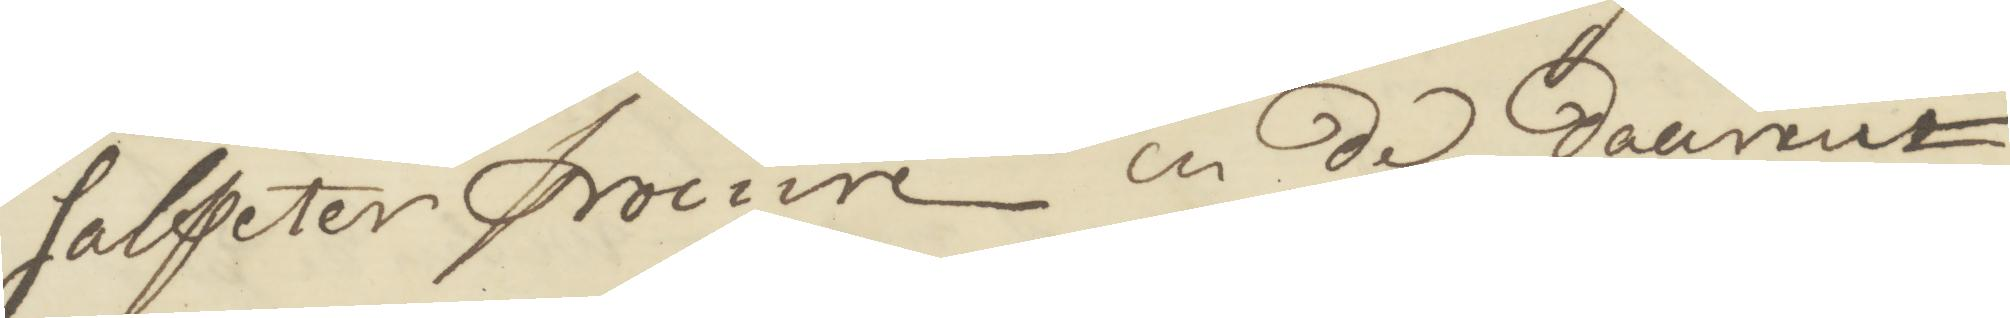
salpeter procure en de daaruit
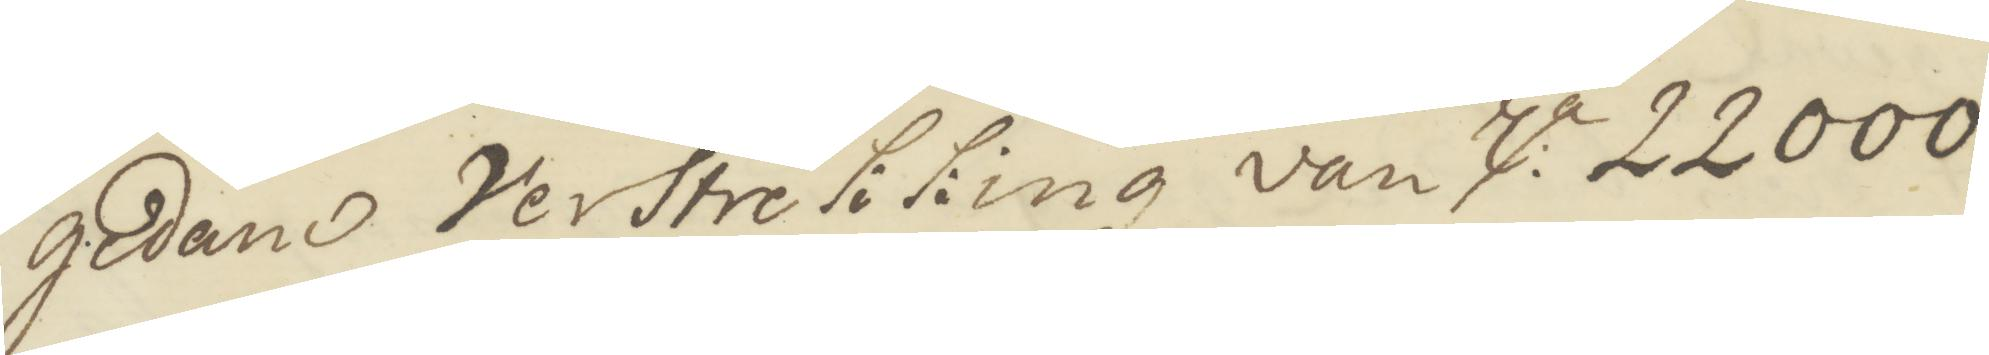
gedane verstrekking van r:a 22000.
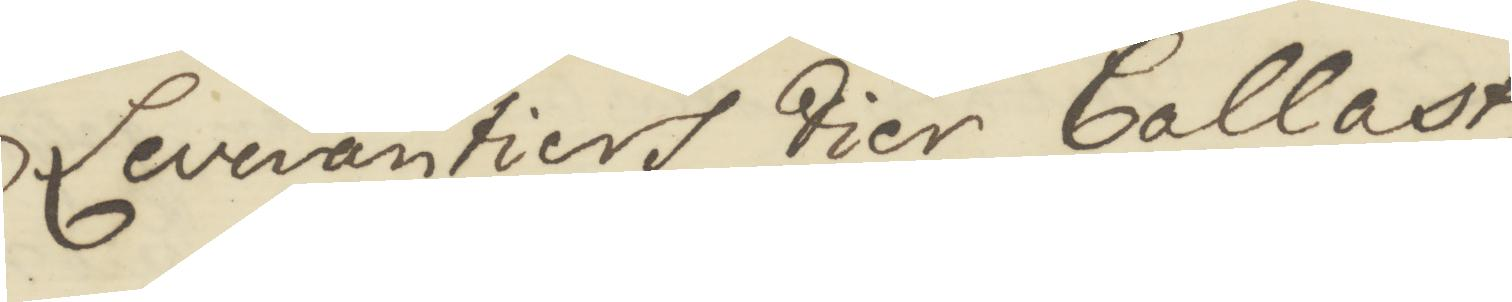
aan de Leverantiers dier ballast.
